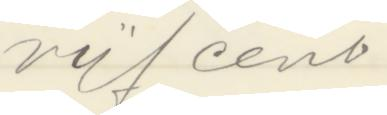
vijf cent
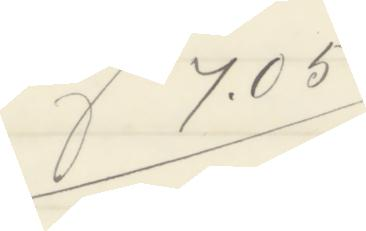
ƒ 7.05
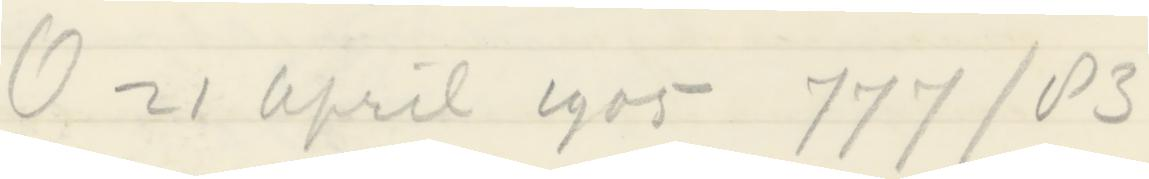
21 april 1905 777/83
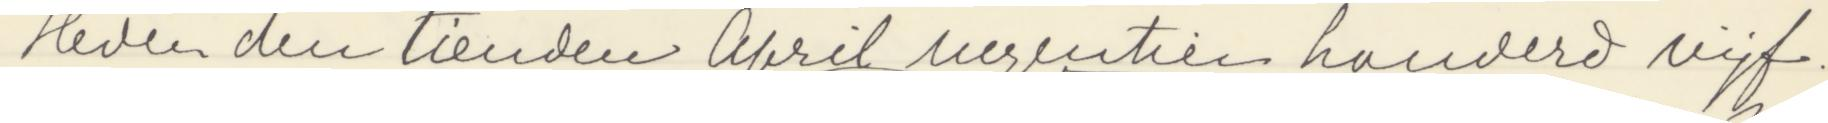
Heden den tienden April negentien honderd vijf
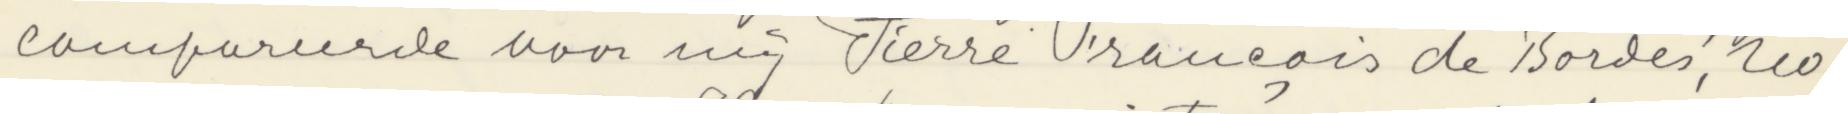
compareerde voor mij Pierre François de Bordes, no-
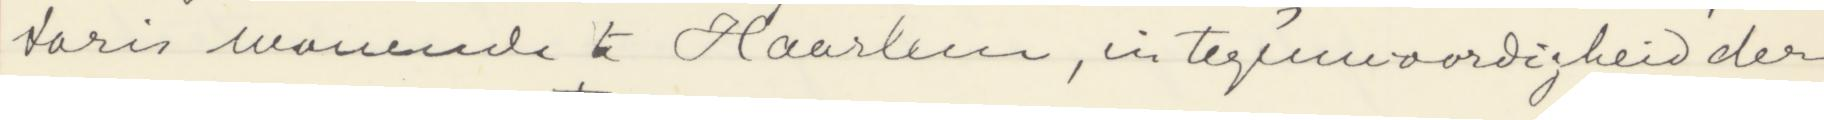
taris wonende te Haarlem, in tegenwoordigheid der
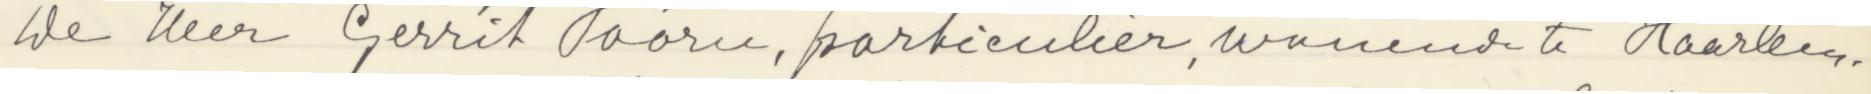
de Heer Gerrit Voorn, particulier, wonende te Haarlem,
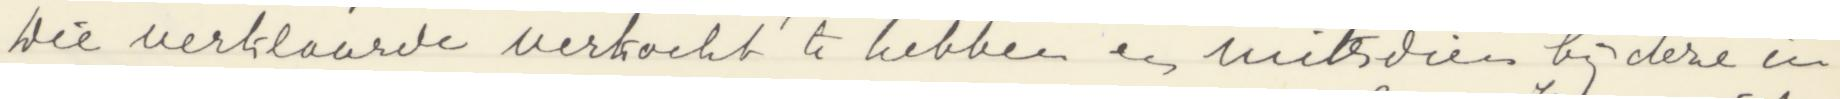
die verklaarde verkocht te hebben en mitsdien bij deze in
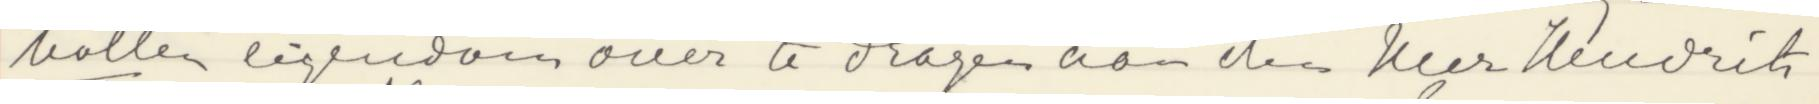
vollen eigendom over te dragen aan den Heer Hendrik
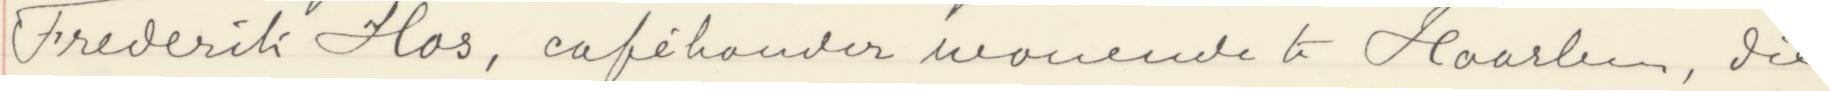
Frederik Hos, caféhouder wonende te Haarlem, die
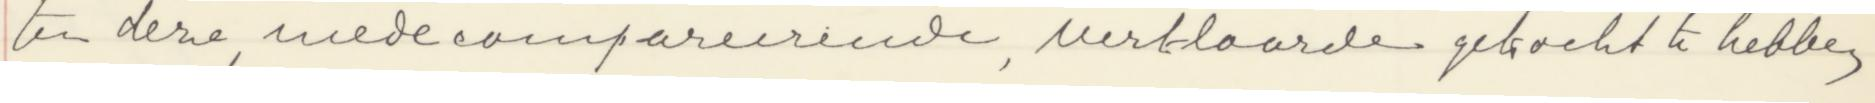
ten deze mede compareerende, verklaarde gekocht te hebben
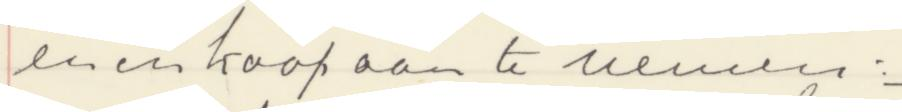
en in koop aan te nemen:
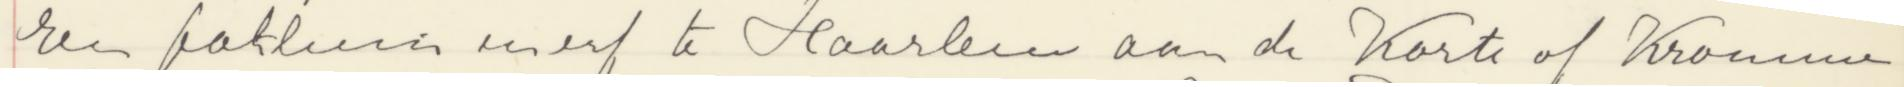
Een pakhuis en erf te Haarlem aan de Korte of Kromme
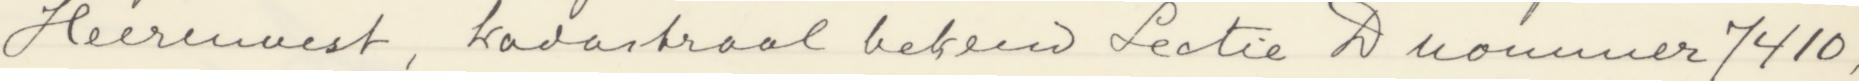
Heerenvest, kadastraal bekeen Sectie D nommer 7410,
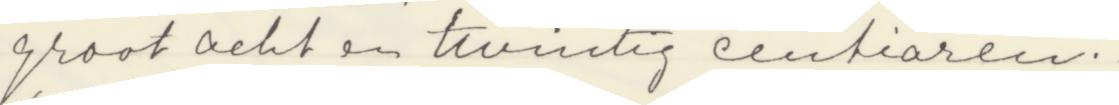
groot acht en twintig centiaren.
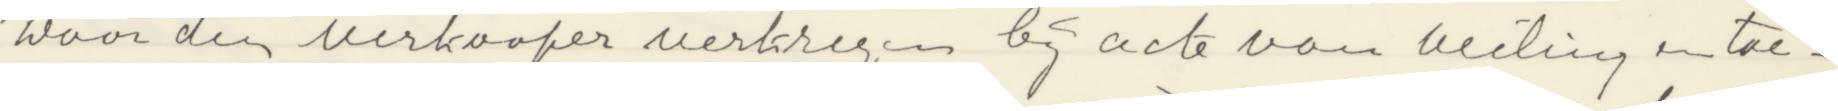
Door den verkooper verkregen bij acte van veiling en toe-
